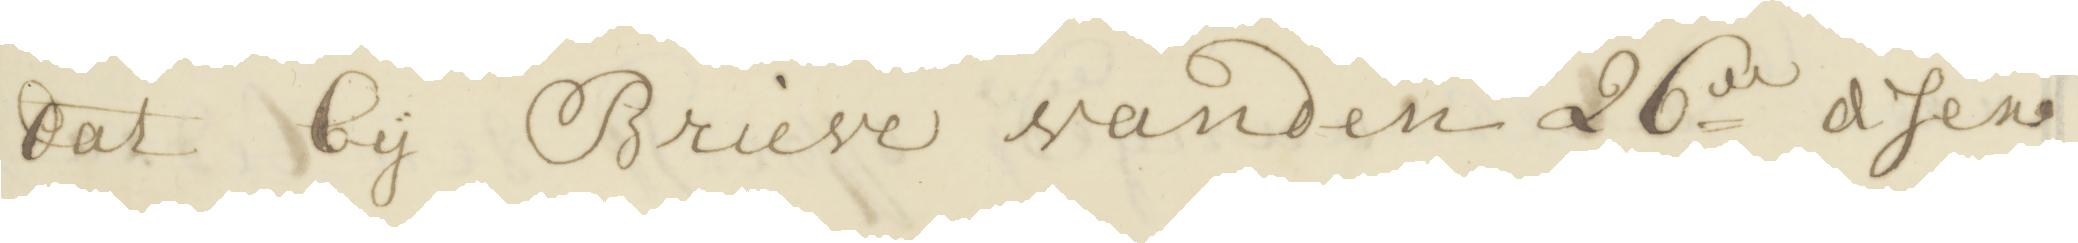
dat bij Brieve vanden 26=en deser
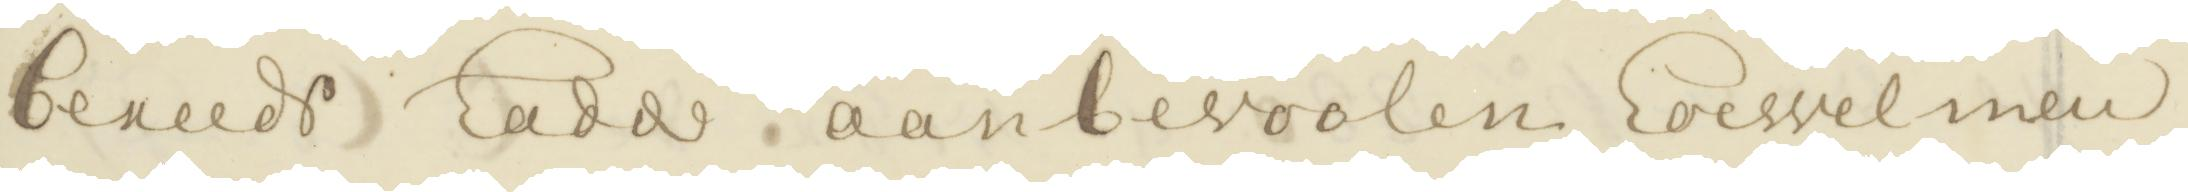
bereeds hadde aanbevoolen, hoewel men
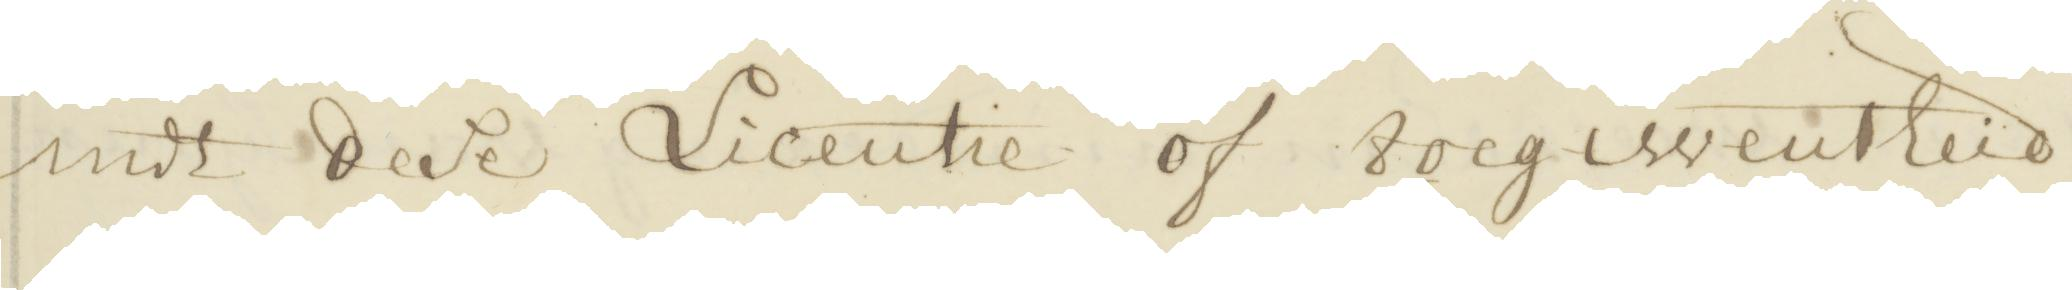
met dese Licentie of toegewentheid
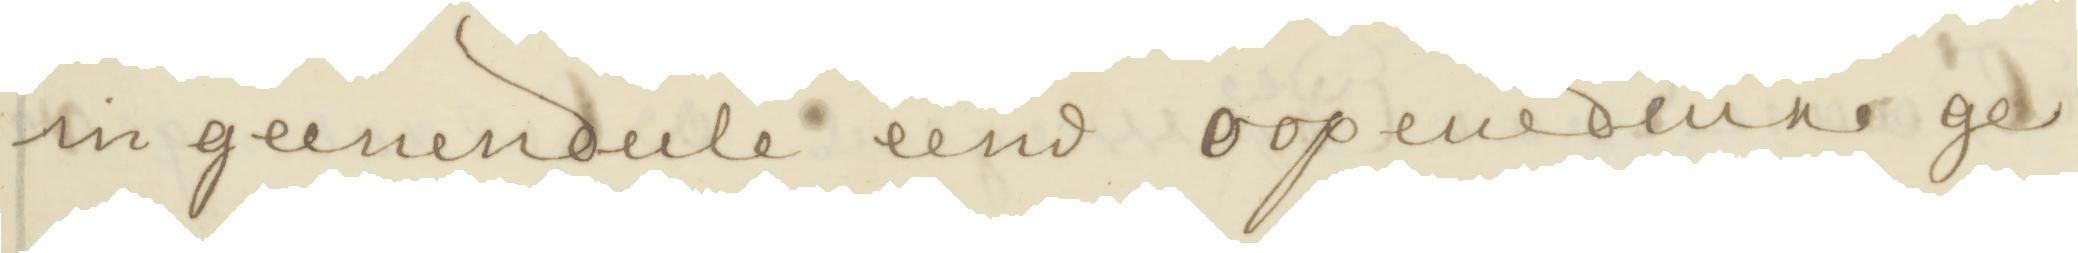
in geenendeele eene oopene deur ge
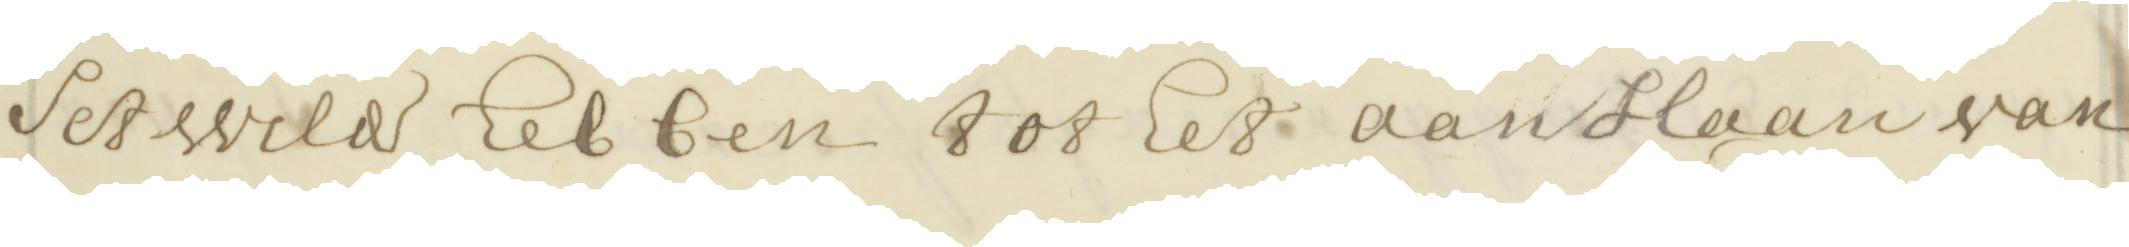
set wilde hebben tot het aanslaan van
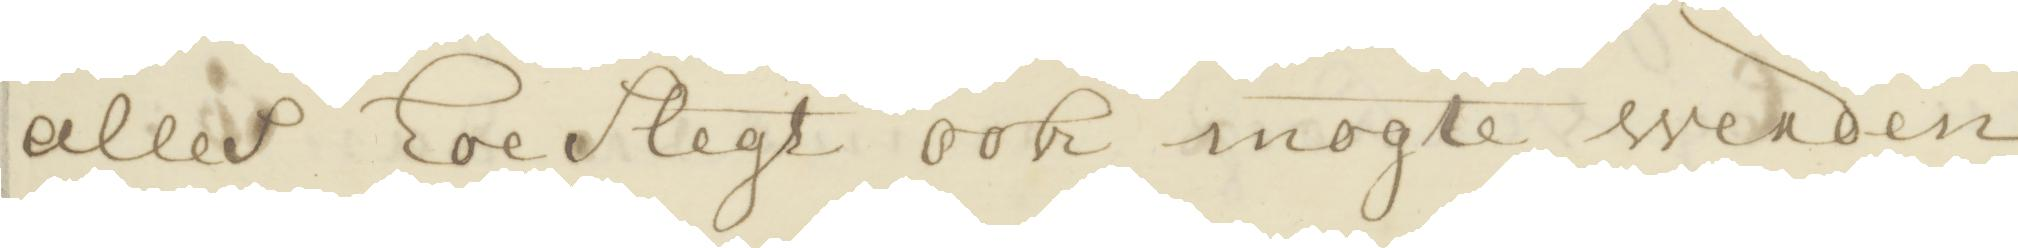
alles hoe slegt ook mogte werden
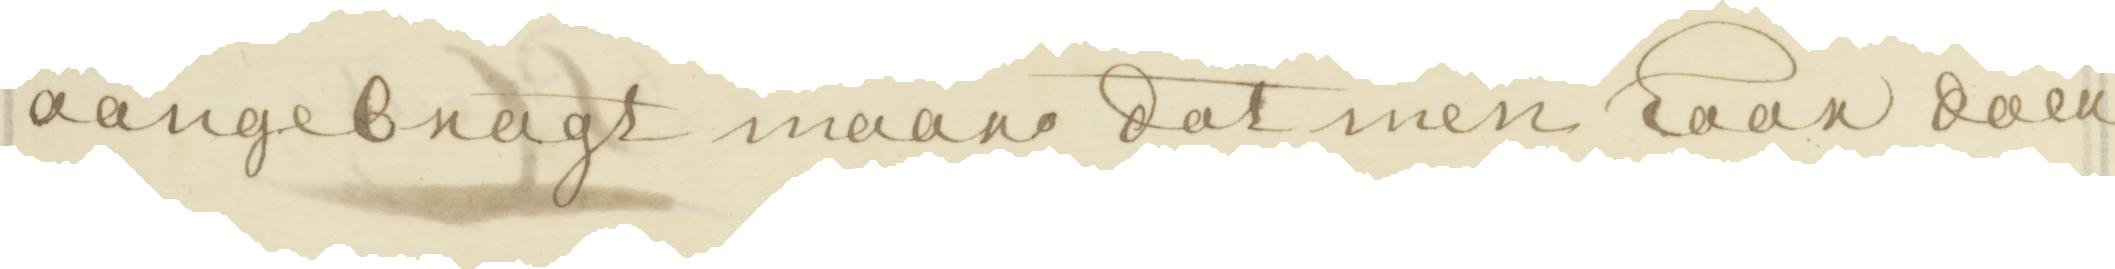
aangebragt maar dat men haar daer
